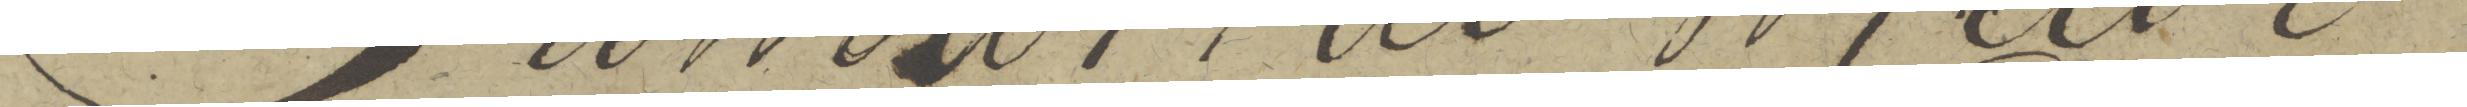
Sumatras Wt Cust
